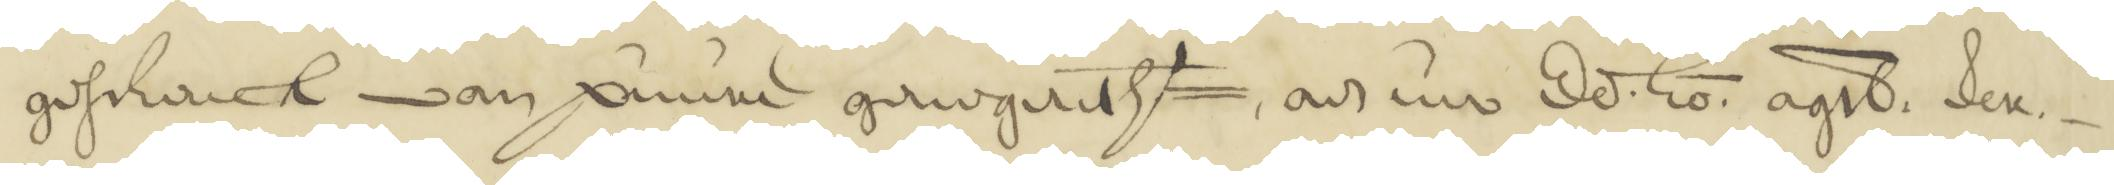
geschenck van puure genegenth=t, aen uw Ed. ho. agtb: Eer.
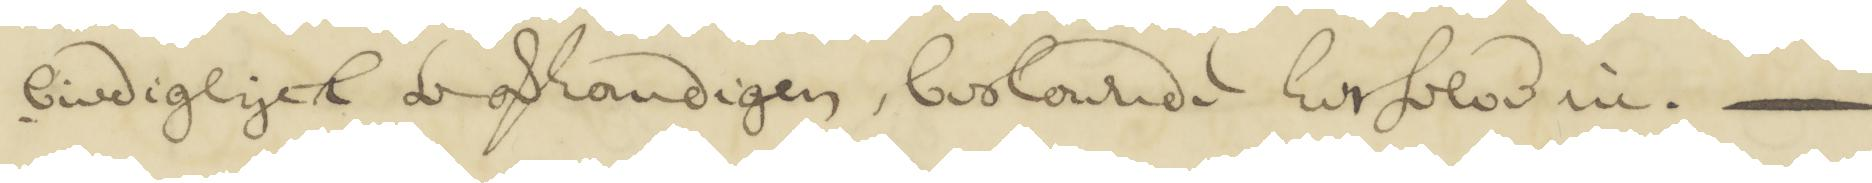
biediglijck te overhandigen, bestaende hetselve in. _
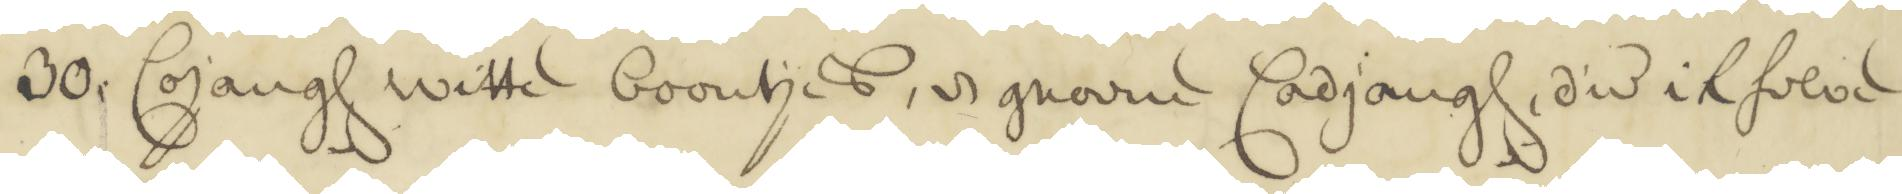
30: Cojangh witte boontjes, en groene Cadjangh, die ik selve
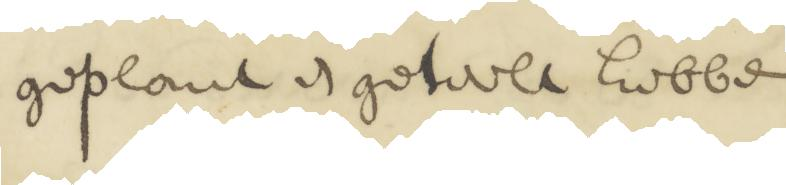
geplant en geteelt hebbe
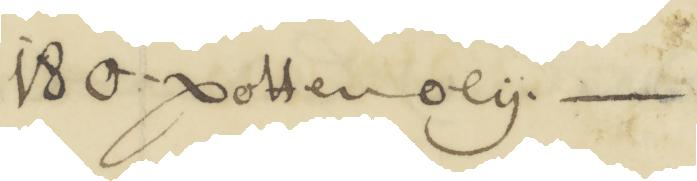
180 potten olij. —
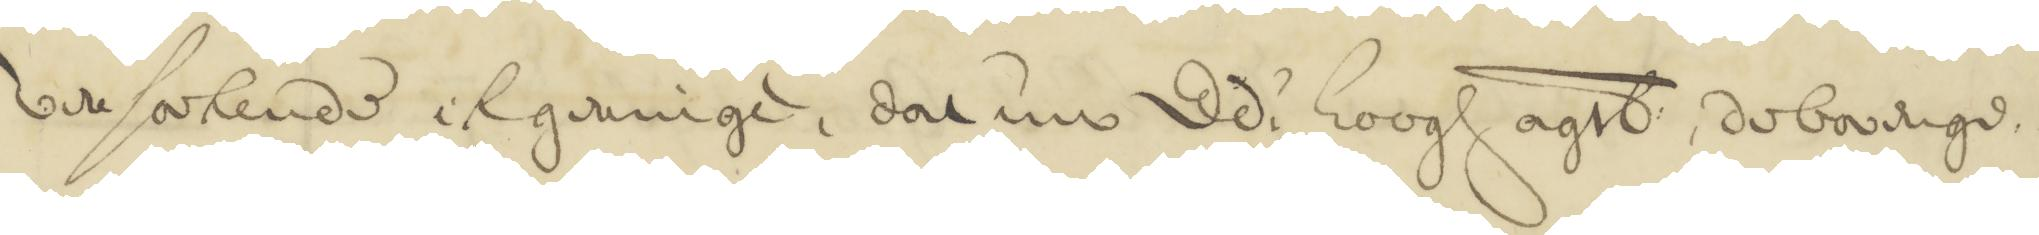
Versoekende ik gernige, dat uw Ed:' hoogh agtb:, de bovenge.
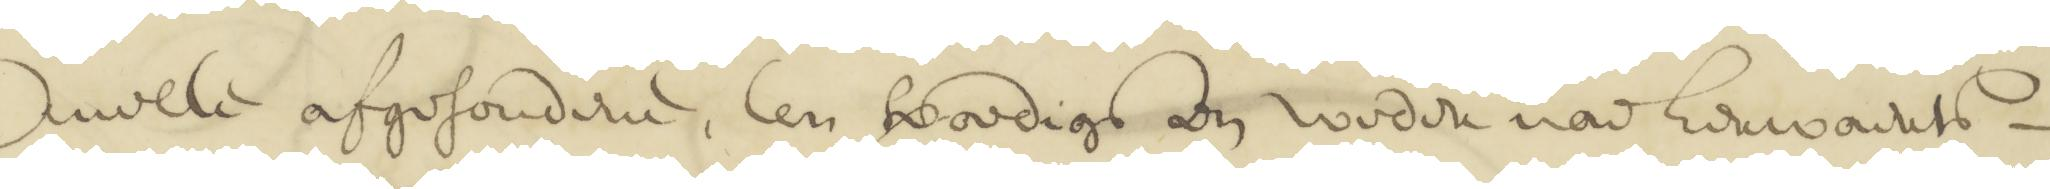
melte afgesondene, ten spoedigsten weder nae herwaerts
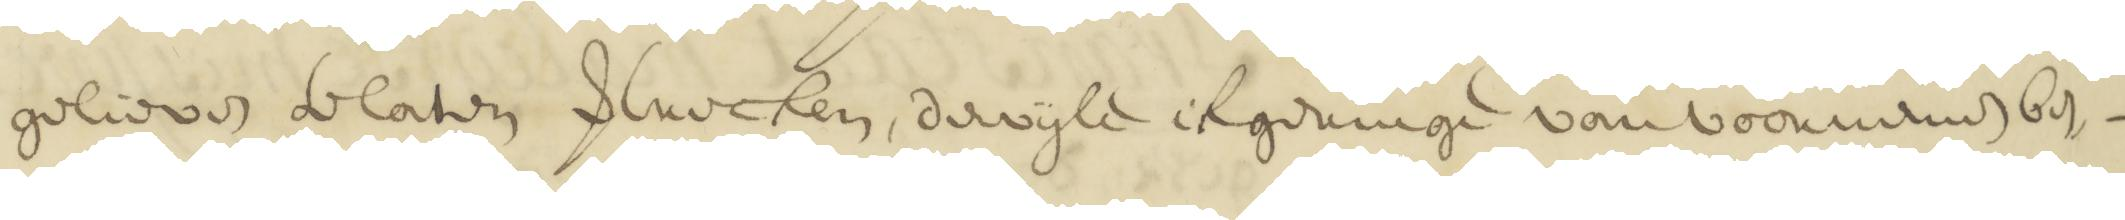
gelieven te laten vertrecken, dewijle ik geringe van voornemen ben,
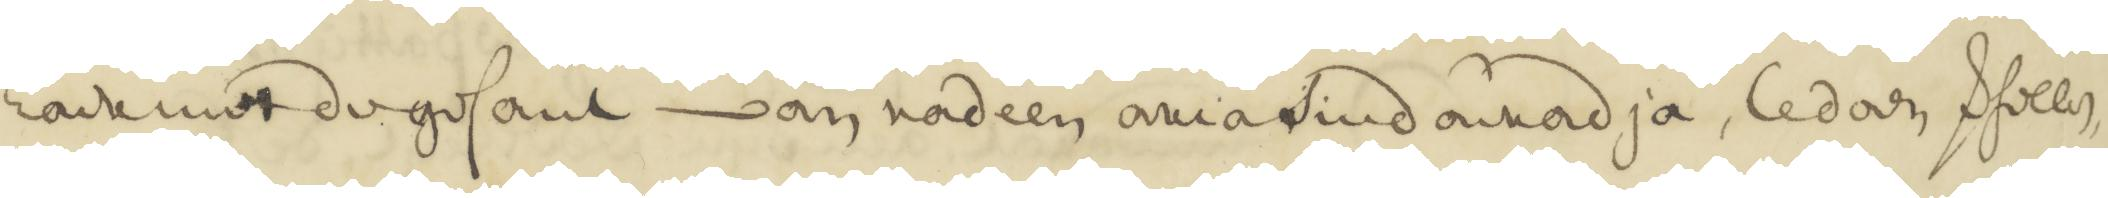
haer met de gesant van radeen ariasind aeradja, te doen versellen
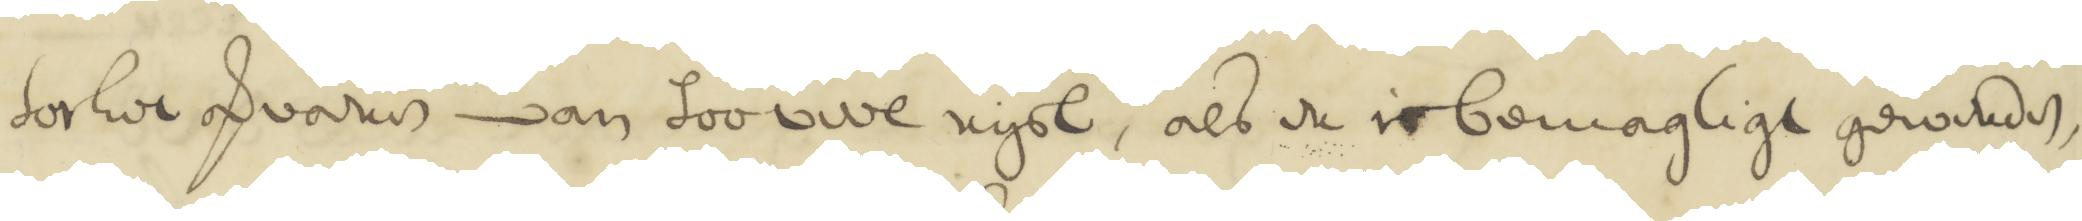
tot het overvoeren van soo veel rijst, als er is bemagtigt gewerden
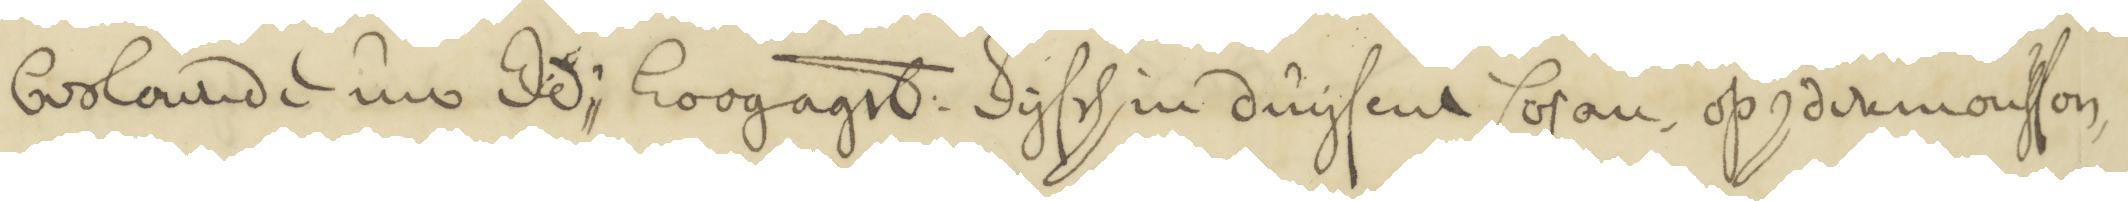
beslaende uw Ed„' hoog agtb: Eijsch in duijsent Cojan, op jdermousson,
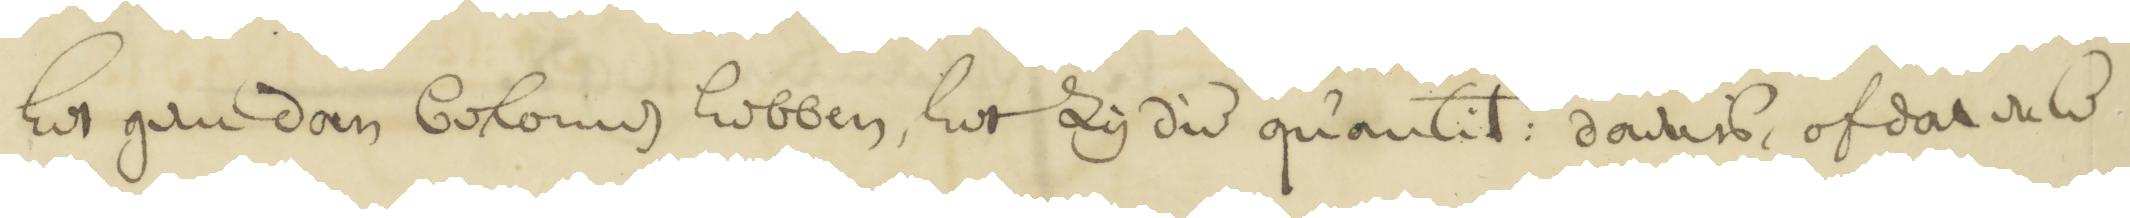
het gem dan bekomen hebben, het zij die quantit:t daer is, of dat er te
